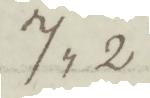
7„ 2
